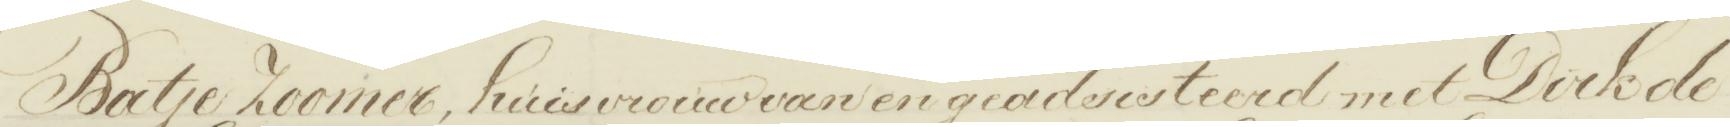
Batje Zoomer, huisvrouw van en geadsisteerd met Dirk de
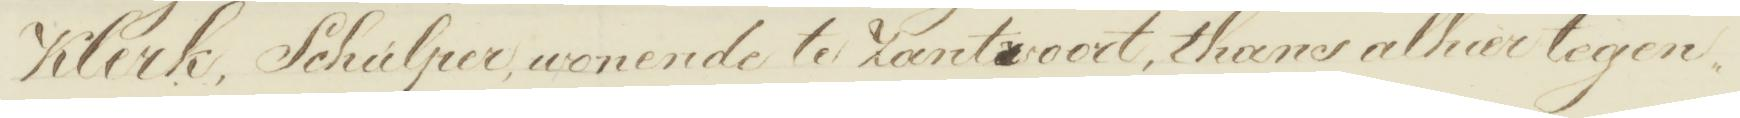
Klerk, Schulper, wonende te zantvoort, thans alhier tegen„
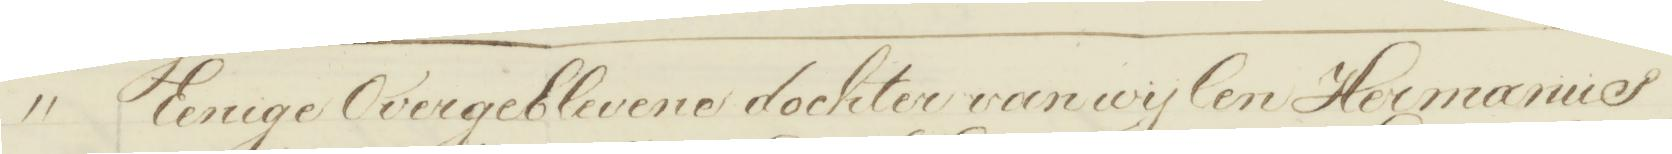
„ Eenige Overgeblevene dochter van wijlen Hermanus
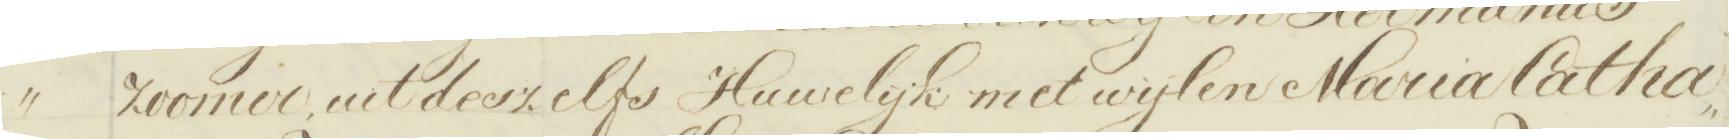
„ zoomer, uit deszelfs Huwelijk met wijlen Maria Catha„
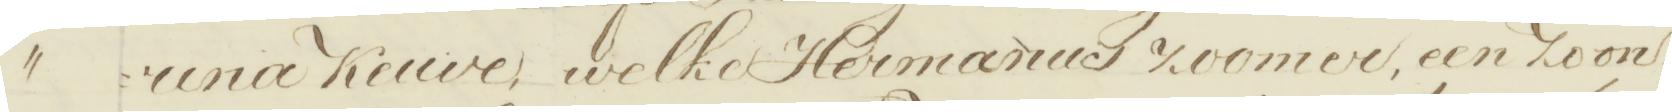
„ =rina Keuve, welke Hermanus zoomer, een zoon
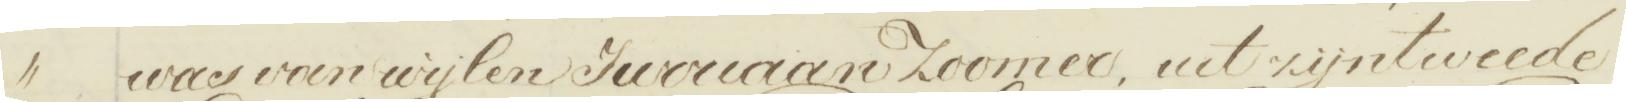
„ was van wijlen Iurriaan Zoomer, uit zijn tweede
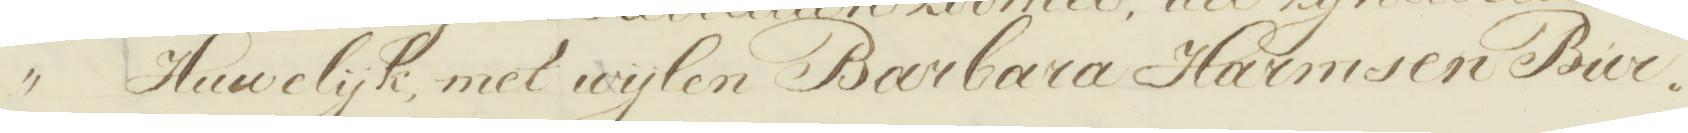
„ Huwelijk, met wijlen Barbara Harmsen Bur„
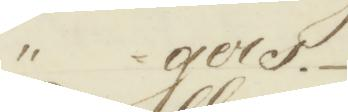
„ =gers.
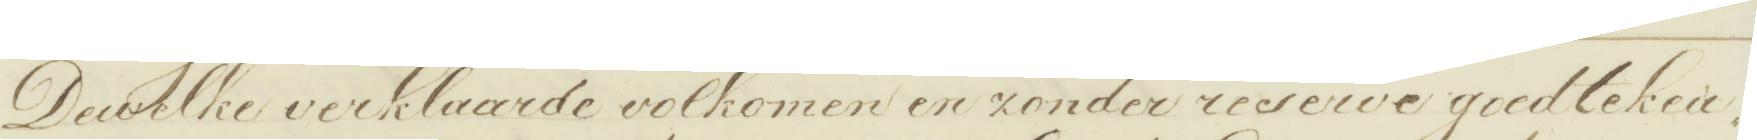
Dewelke verklaarde volkomen en zonder reserve goedtekeu„
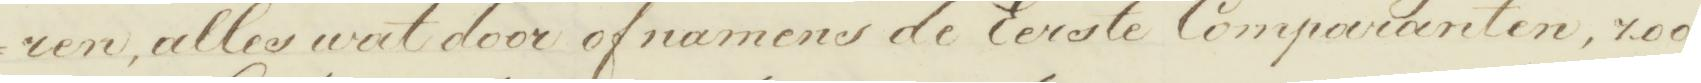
ren, alles wat door of namens de Eerste Comparanten, zoo
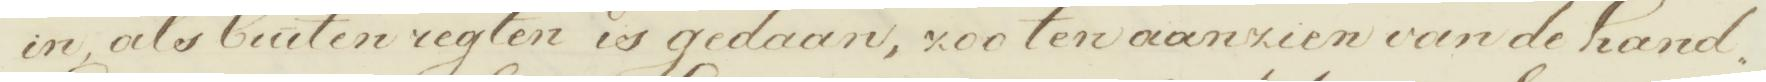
in, als buiten regten is gedaan, zoo ten aanzien van de hand„
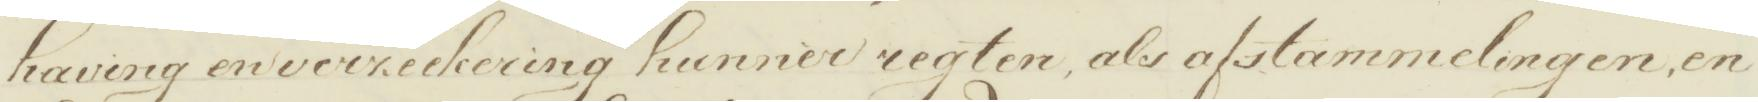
having en verzeekering hunner regten, als afstammelingen, en
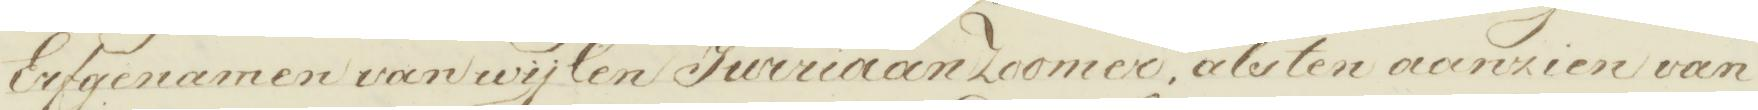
Erfgenamen van wijlen Iurriaan Zoomer, als ten aanzien van
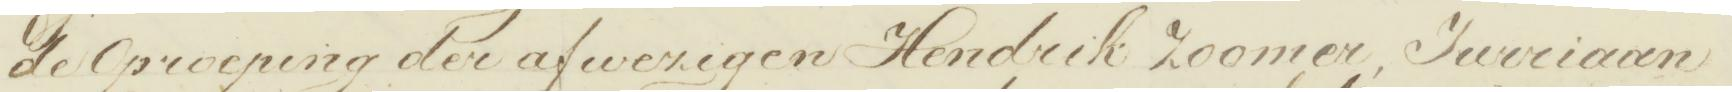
de Oproeping der afwezigen Hendrik Zoomer, Iurriaan
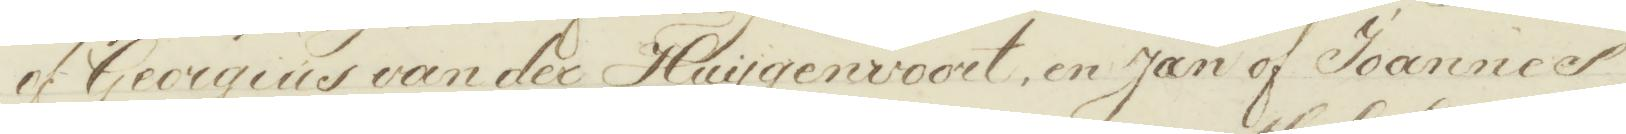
of Georgius van der Huijgenvoort, en Jan of Ioannes
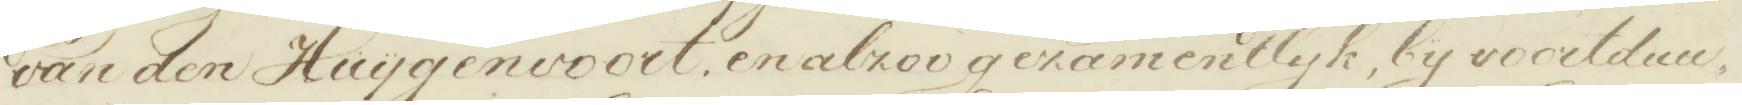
van den Huijgenvoort, en alzoo gezamentlyk, bij voortduu„
